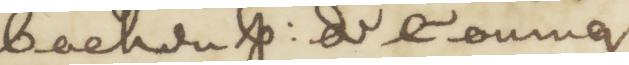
boeken p:r de Coning
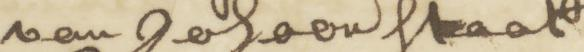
van Johoor staat
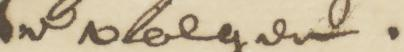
te volgen.
